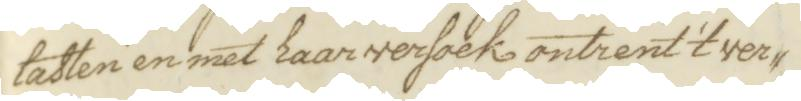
lasten en met haar versoek ontrent ’t ver„
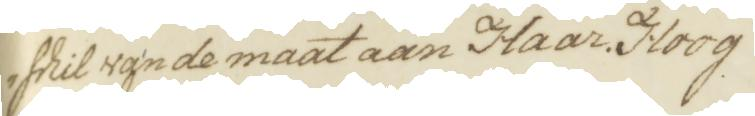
„schil van de maat aan Haar Hoog
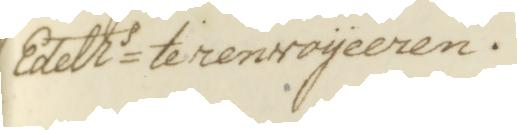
Edelh=s te renvoijeeren.
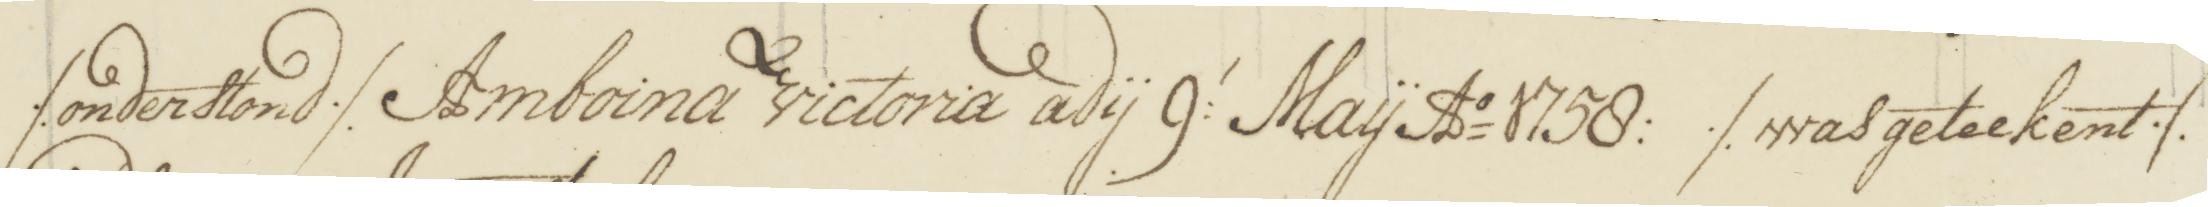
/onderstond/ Amboina victoria adij 9: Maij A=o 1758: ./. was geteekent ./.
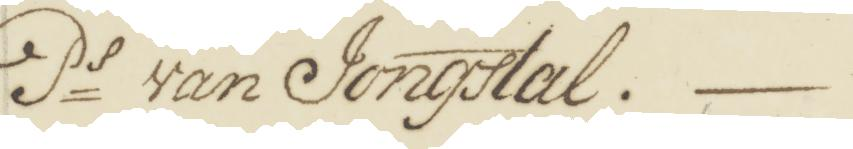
P=s van Iongstal. —
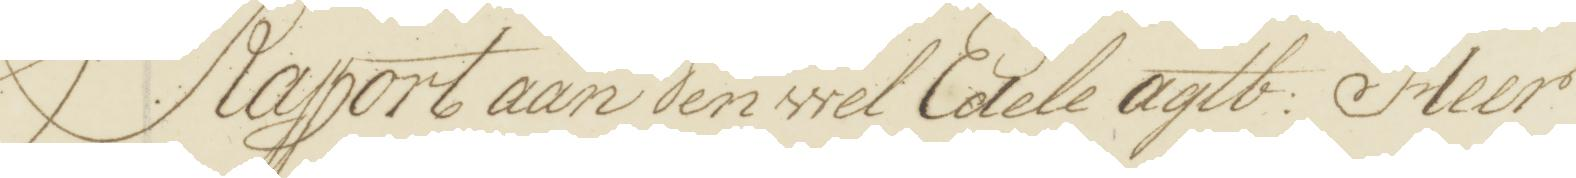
Rapport aan den wel Edele agtb: Heer
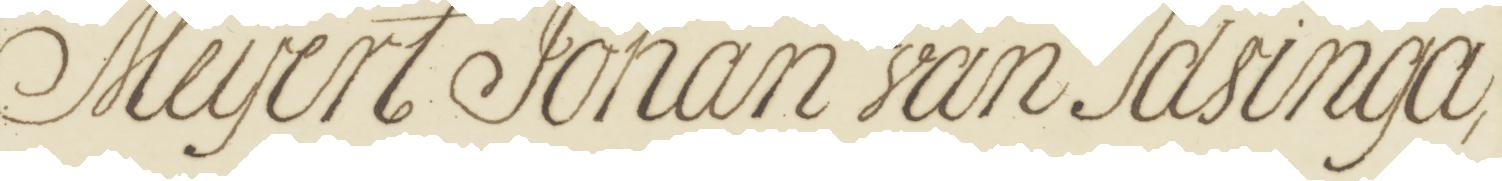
Meijert Johan van Idsinga,
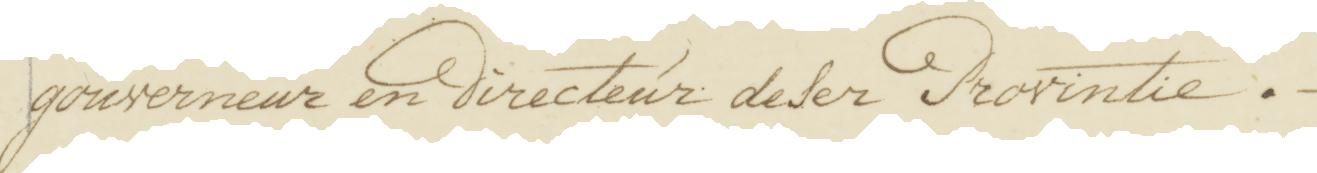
gouverneur en directeur deser Provintie. —
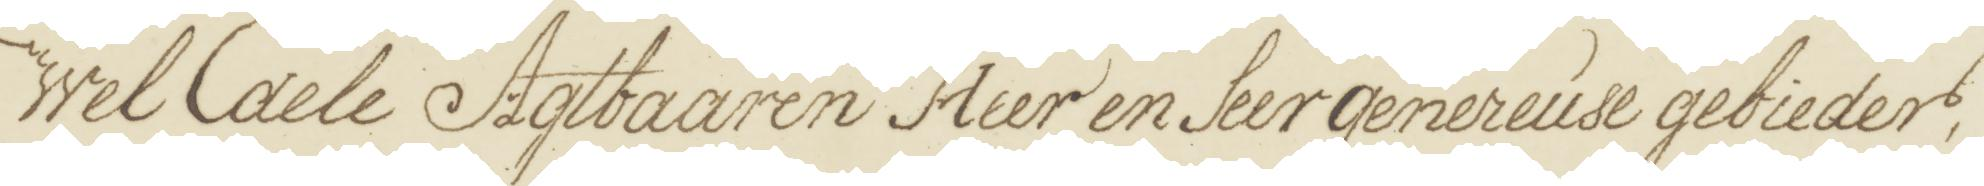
wel Edele Agtbaaren Heer en Seer genereuse gebieder,
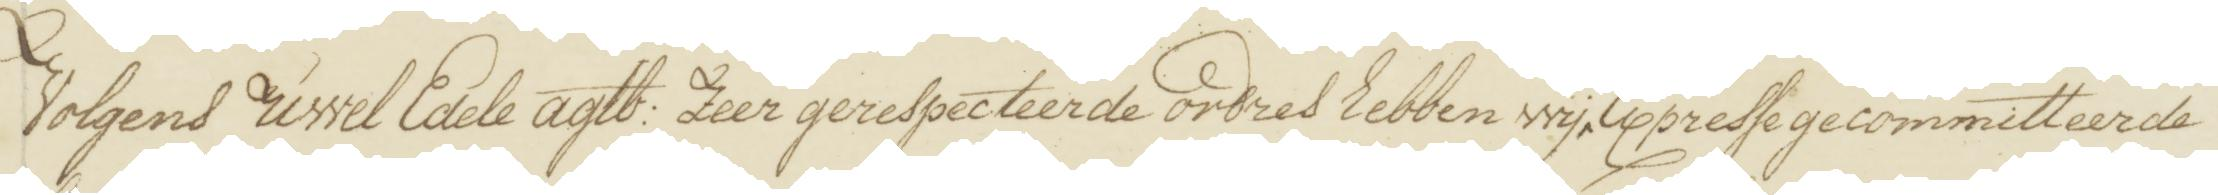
Volgens uwel Edele agtb: Zeer gerespecteerde ordres hebben wij^ Expresse gecommitteerde
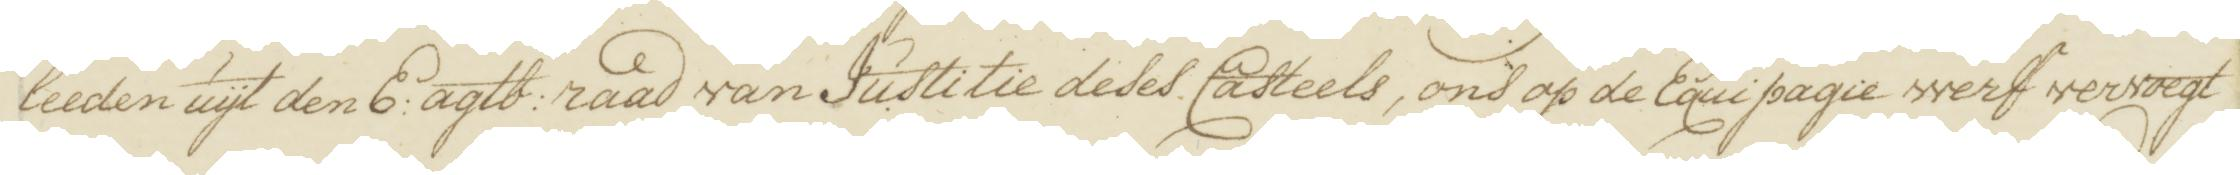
leeden uijt den E: agtb: raad van Iustitie deses Casteels, ons op de Equipagie werf vervoegt
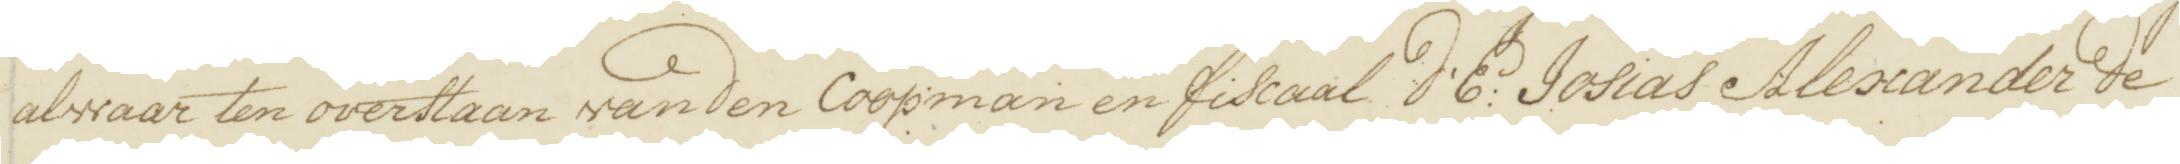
alwaar ten overstaan van den Coopman en fiscaal d’ E: Josias Alexander de
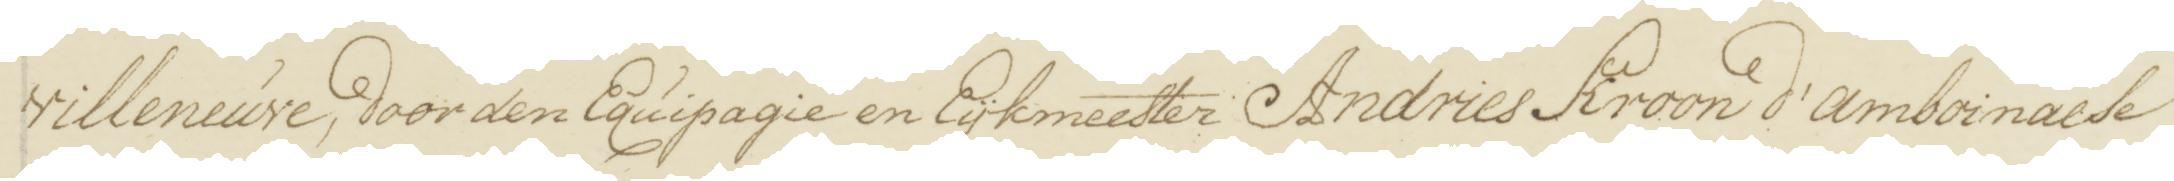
Villeneuve, door den Equipagie en Eijkmeester Andries Kroon d’ Amboinaese
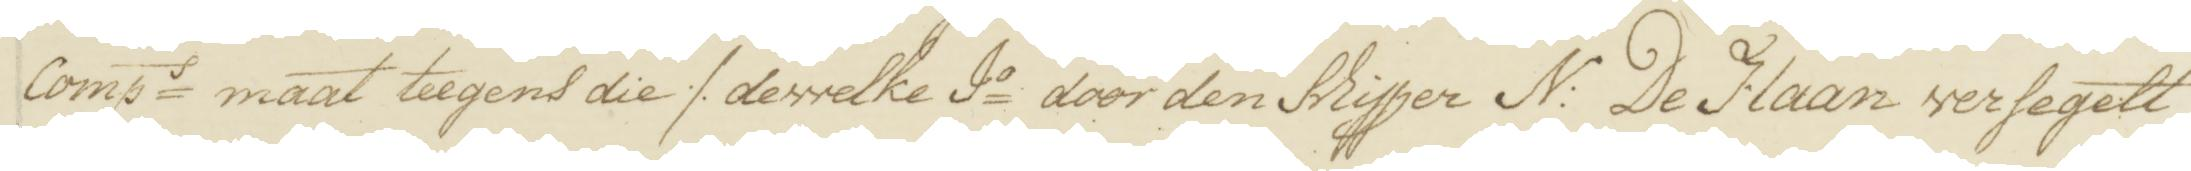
Comp=s maat teegens die ./. dewelke J=o door den Schipper N: De Haan versegelt
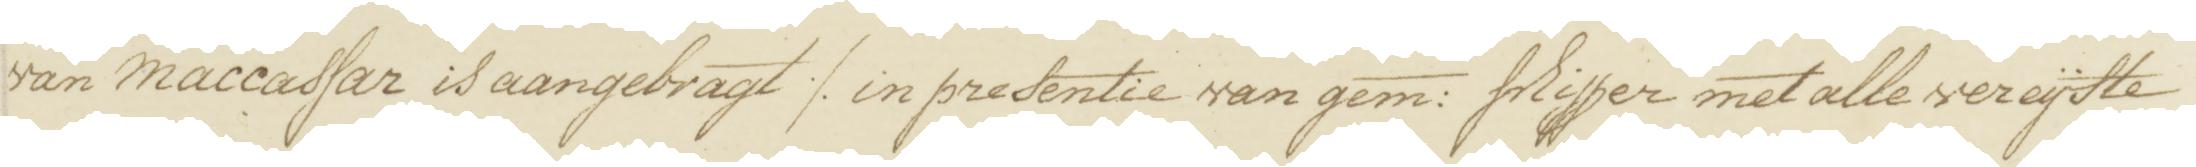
van maccassar is aangebragt ./. in presentie van gem: Schipper met alle vereijste
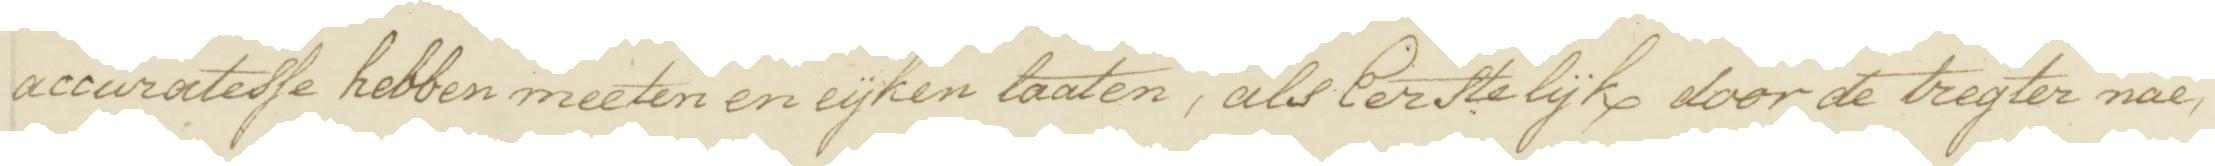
accuratesse hebben meeten en eijken laaten, als Eerstelijk door de tregter nae,
